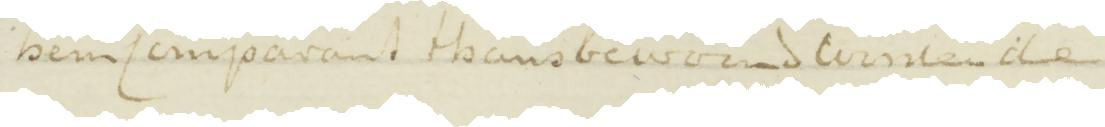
hem Comparant thans bewoond wordende
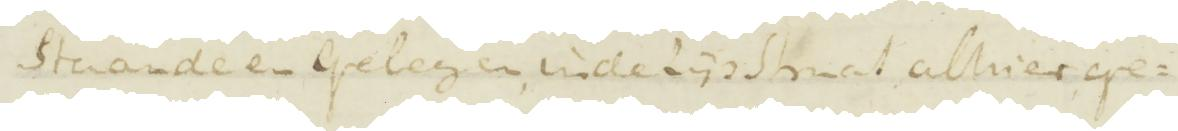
staande en gelegen, in de zijsstraat, alhier ge=
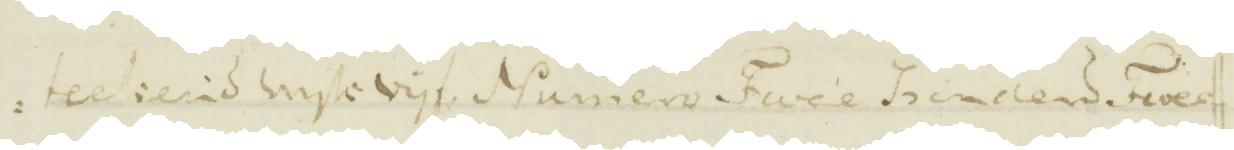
=teekend wyk vijf. Numero Twee honderd Twee=
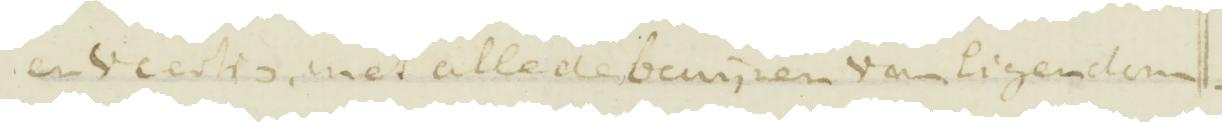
en veertig met alle de bewijzen van Eigendom
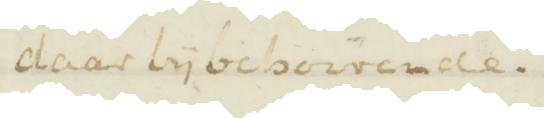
daar bij behoorende.
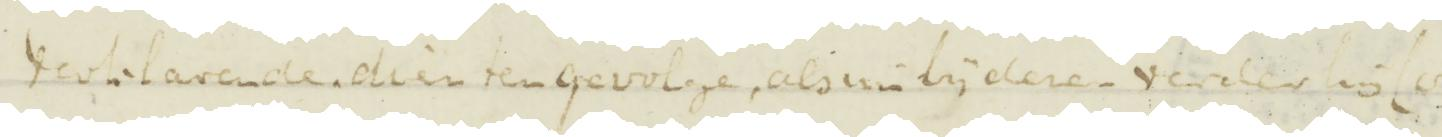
Verklarende dien ten gevolge, als nu bij deze - verder is C
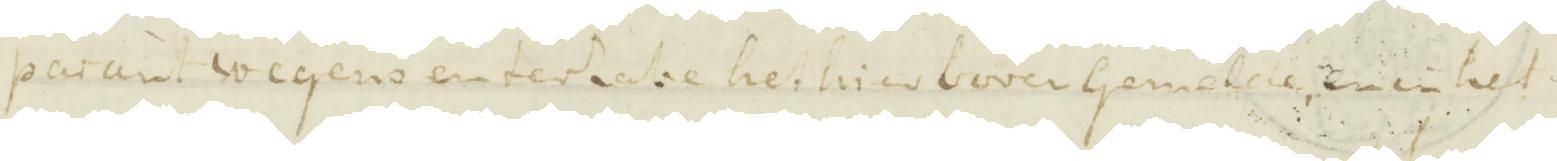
parant wegens en terzake het hier boven Gemelde, en in het
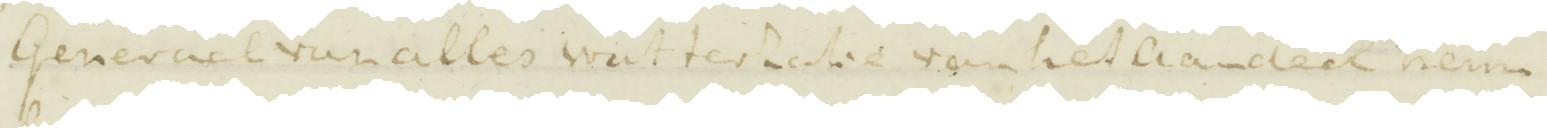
Generaal van alles wat terzake van het aandeel hem
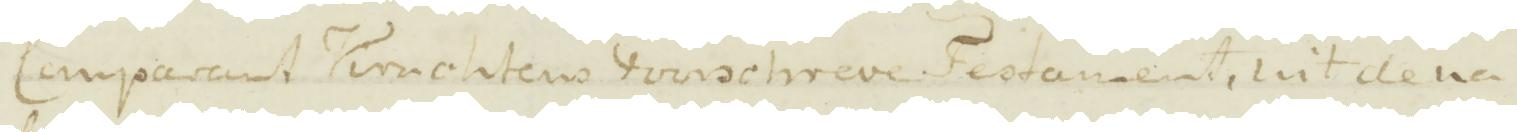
Comparant Krachtens voorschreve Testament, uit de na
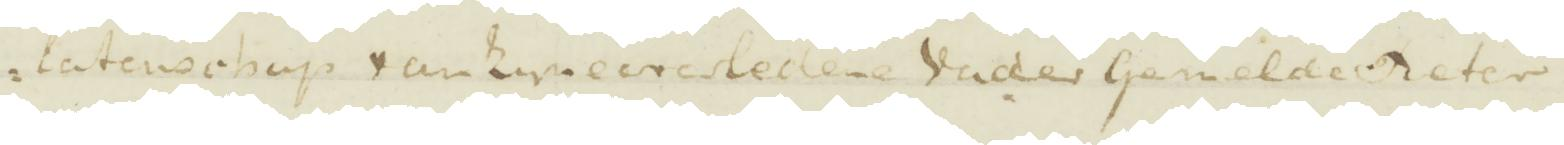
=latenschap van zyne overledene Vader Gemelde Pieter
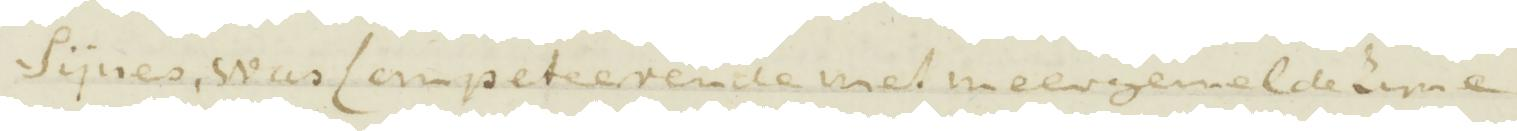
Sijnes, was Competeerende met meergemelde zyne
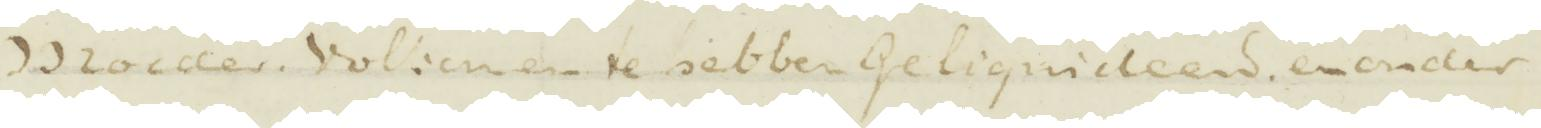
Moeder. Volkomen te hebben Geliquideerd, en onder
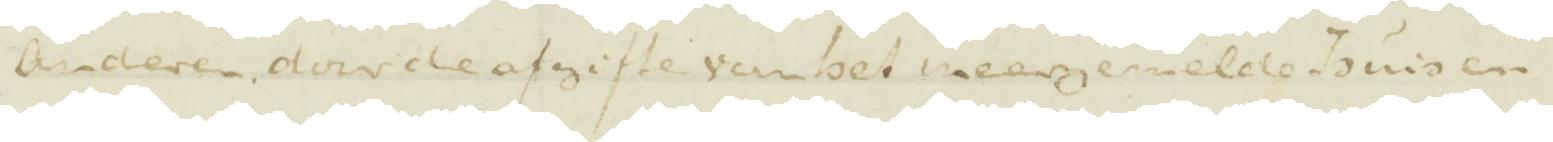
anderen, door de afgifte van het meergemelde huis en
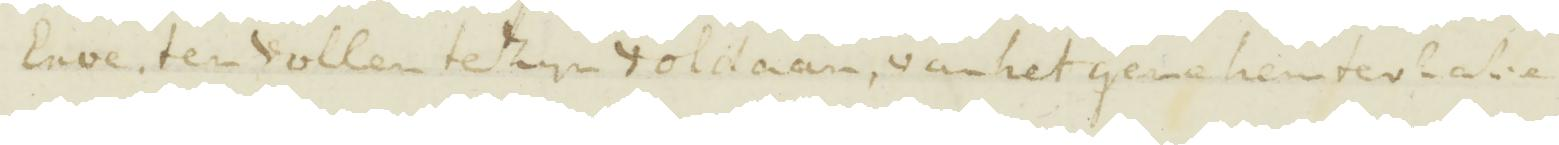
Erve, ten vollen te zyn voldaan, van het gene hem ter zake
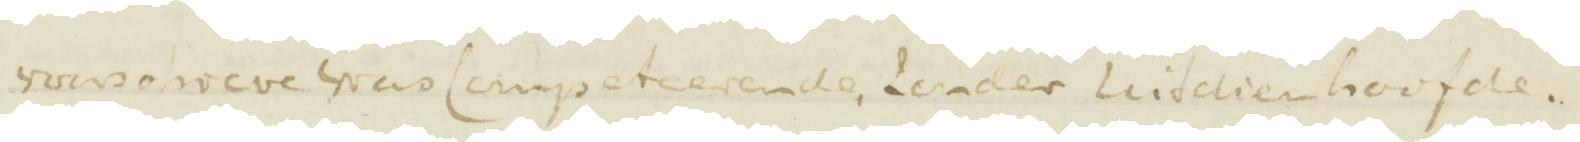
voorschreve was Competeerende, zonder uitdien hoofde„
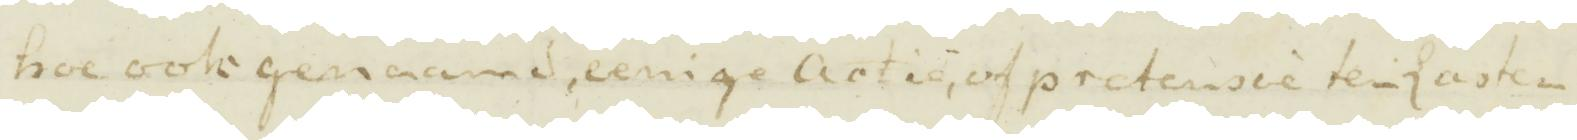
hoe ook genaamd, eenige Actie, of pretensie ten Lasten
